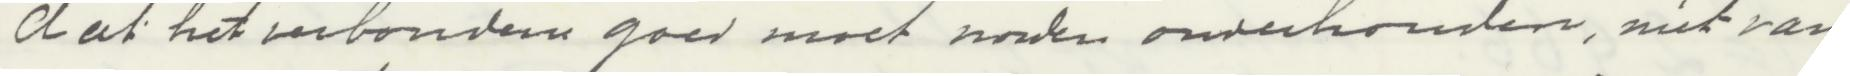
dat het verbondene goed moet worden onderhouden, niet van
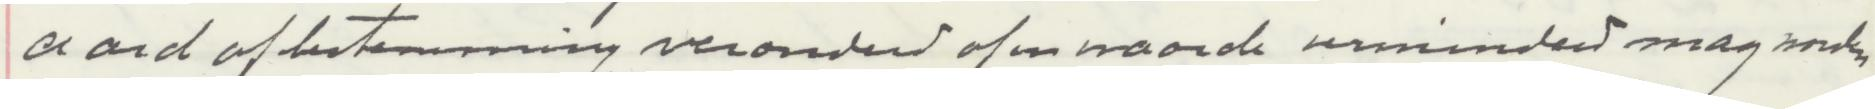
aard of bestemming veranderd of in waarde verminderd mag worden
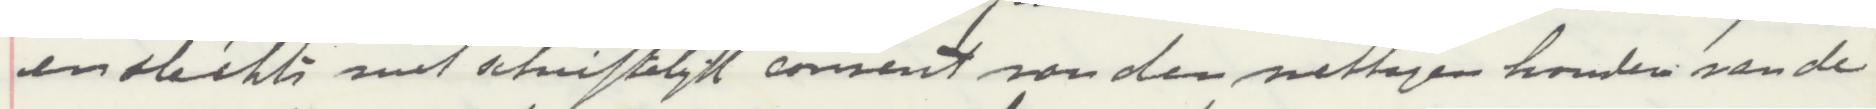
en slechts met schriftelijk consent van den wettigen houder van de
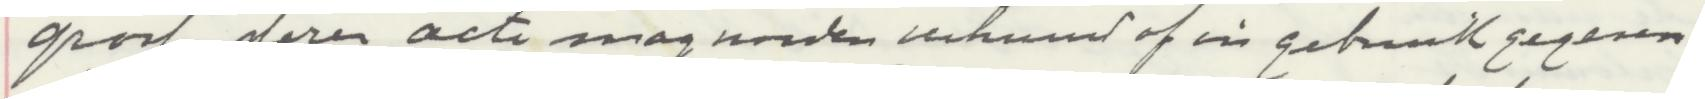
grosse dezer acte mag worden verhuurd of in gebruik gegeven
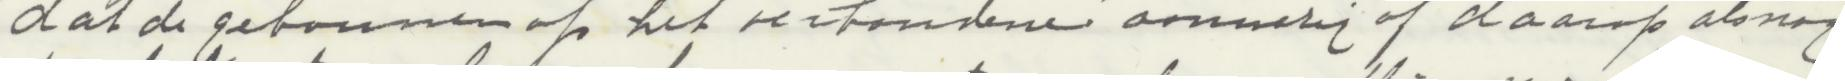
dat de gebouwen op het verhondene aanwezig of daarop als nog
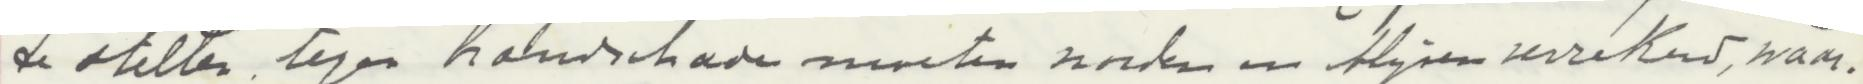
te stellen, tegen brandschade moeten worden en blijven verzekerd, waar-
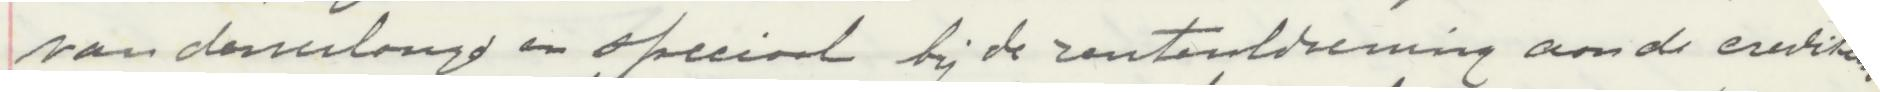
van dezenlenge en speciaal bij de rentelossing aan de crediteu
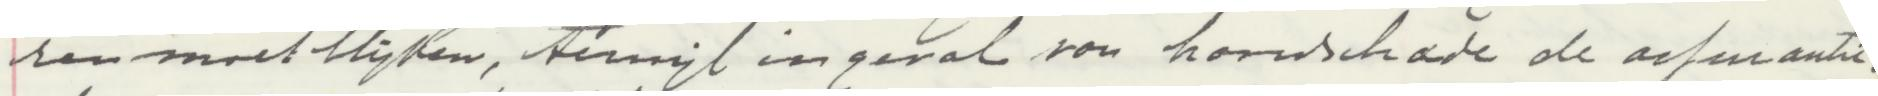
ren moet blijken, terwijl in geval van haardschade de assurantie
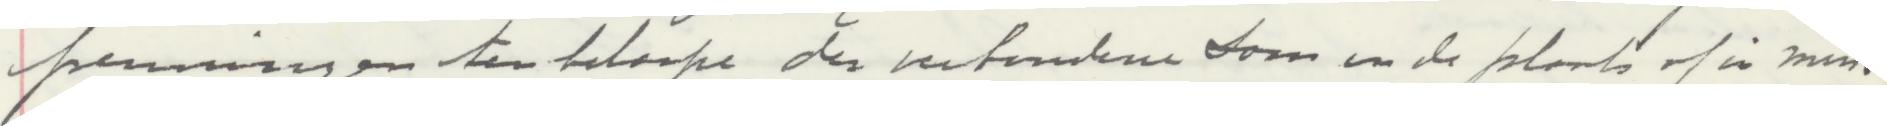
penningen ten beloope der verbondene som in de plaats of in min„
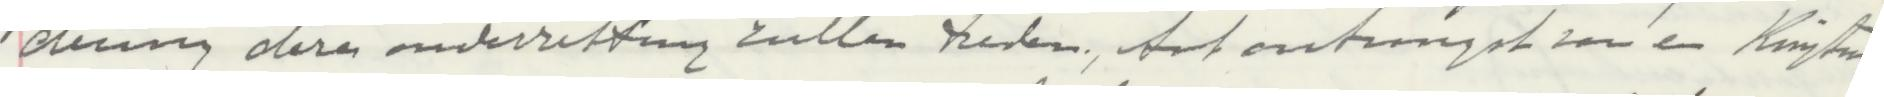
dering dezer onderzetting zullen treden., tot ontvangst van en kwijting
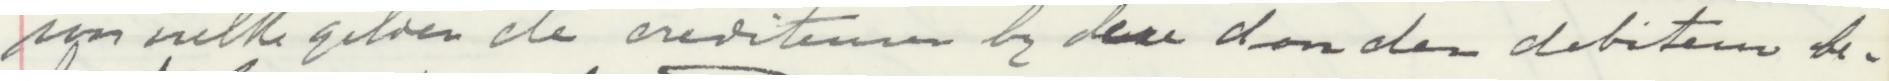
van welke gelden de crediteuren by deze dan den debiteur be.
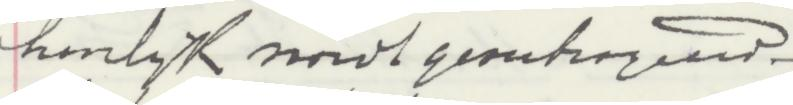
hoorlyk wordt gesubrogeerd.
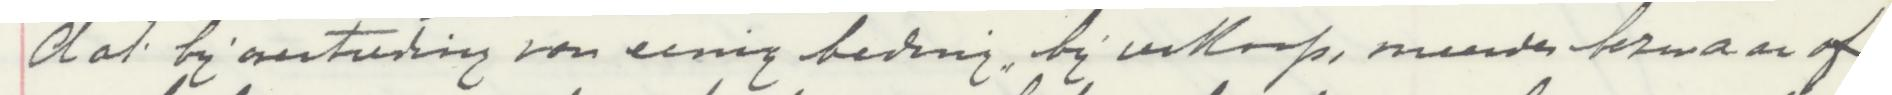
dat by overtreding van eenig beding, bij verkoop, minder bezwaar of
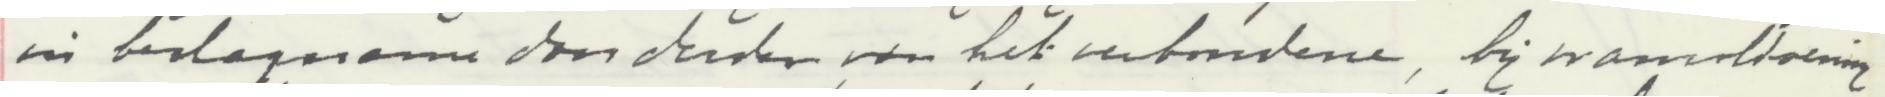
in beslagname door derden van het verbordene, bij wanvoldoening
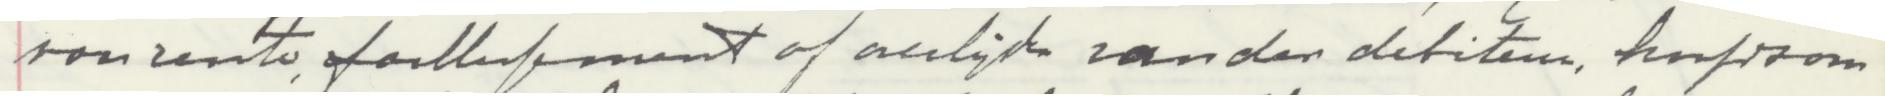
voor rente, faillissement of overlijden van der debiteur, hoofdsom
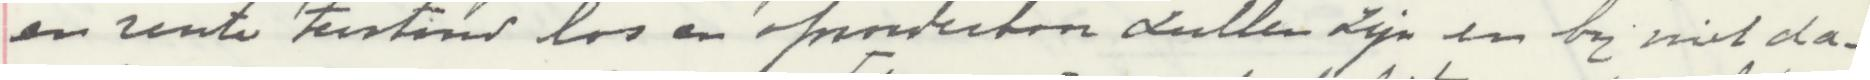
en rente terstond los en opvorderbaar zullen zijn en bij niet da-
